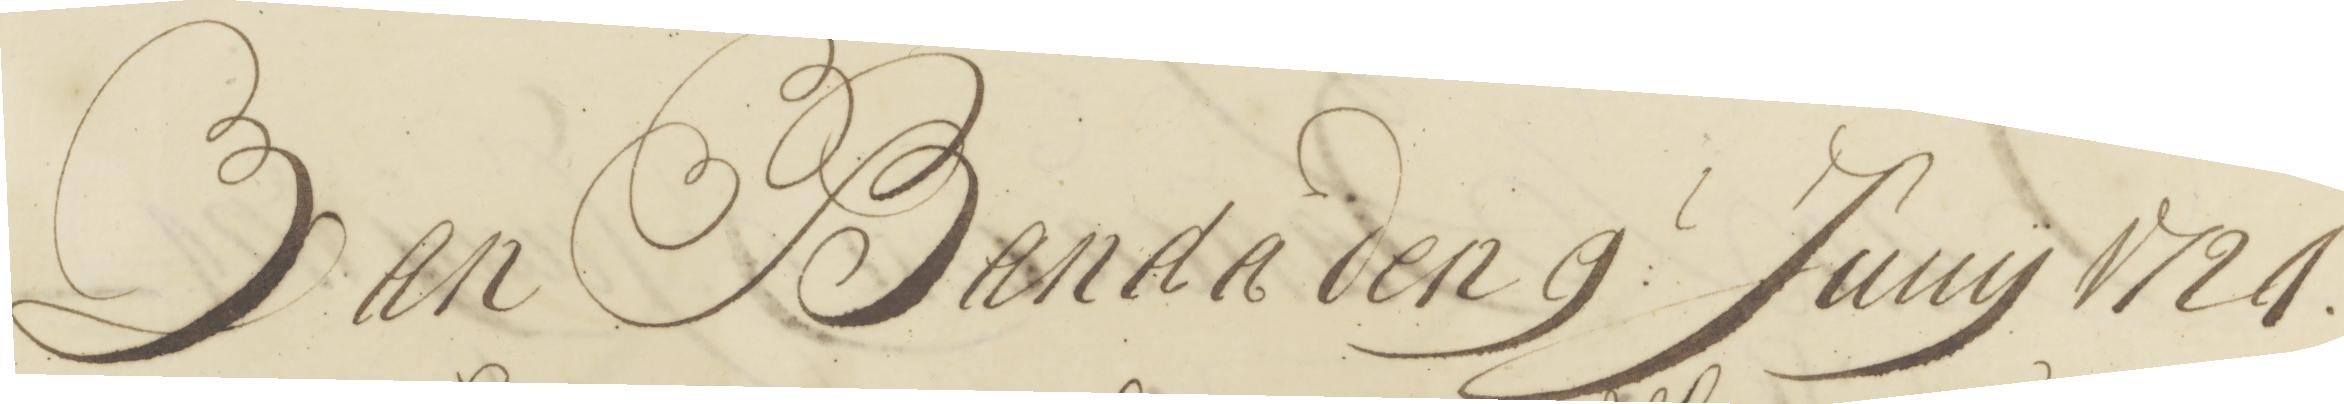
Van Banda den 9:' Junij 1724
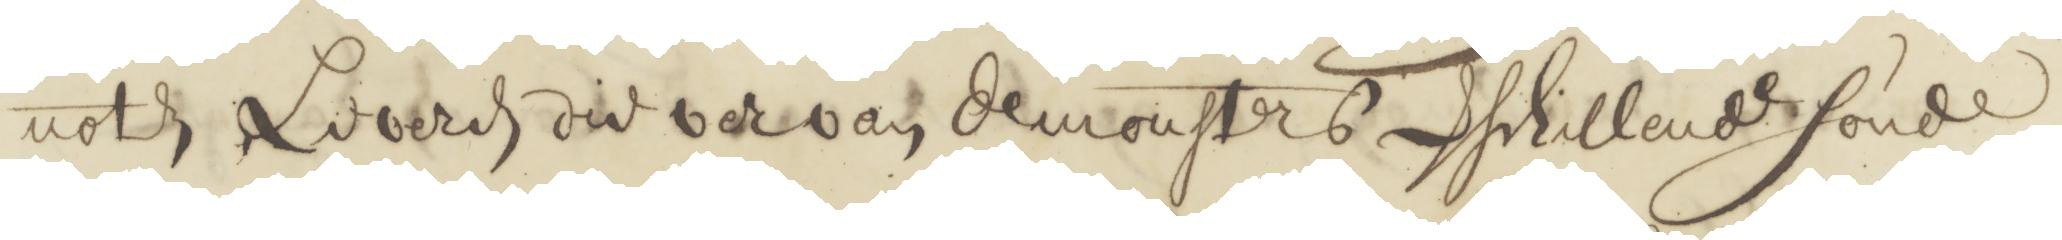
noten Leveren die ver van de monsters verschillende soude
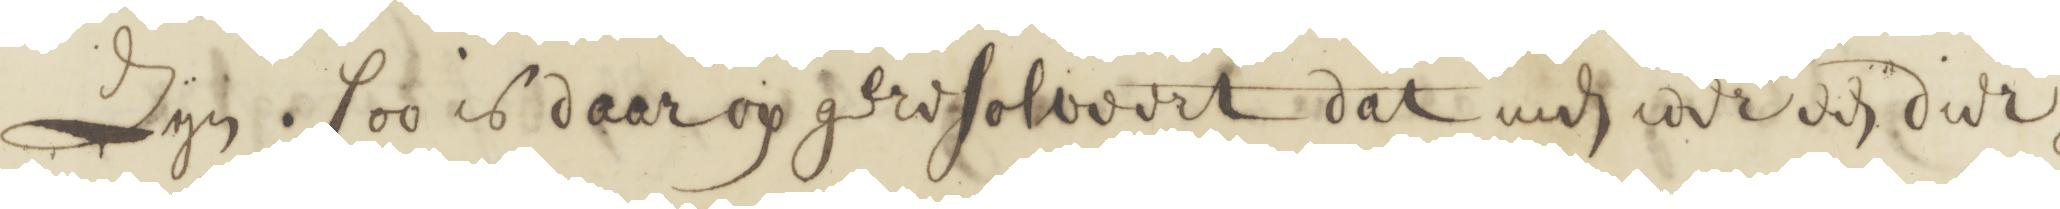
zijn. soo is daar op geresolveert dat men ider een dier
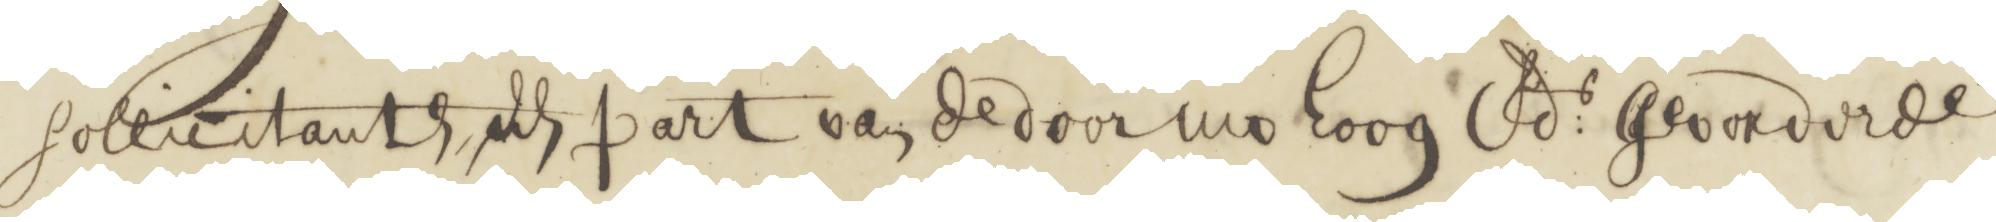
sollicitanten, een part van de door uw hoog Ed:s gevorderde
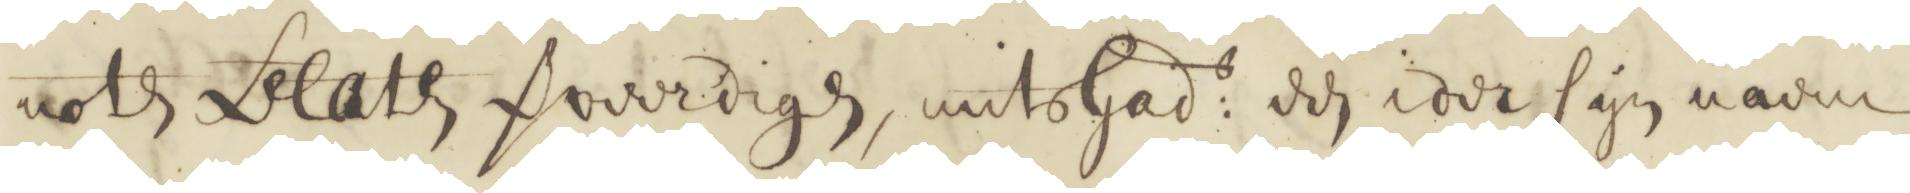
noten telaten verveerdigen, mitsgad:s een ider sijn naem
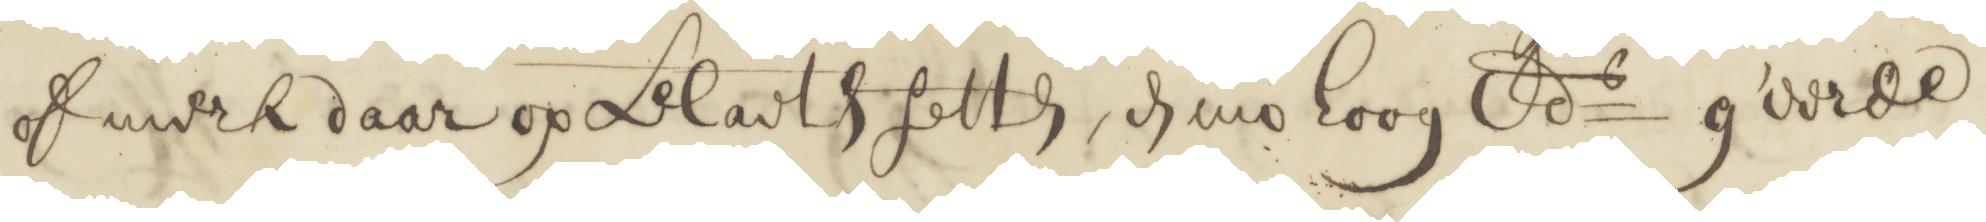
of merk daar op telaeten setten, en uw hoog Ed=s g’eerde
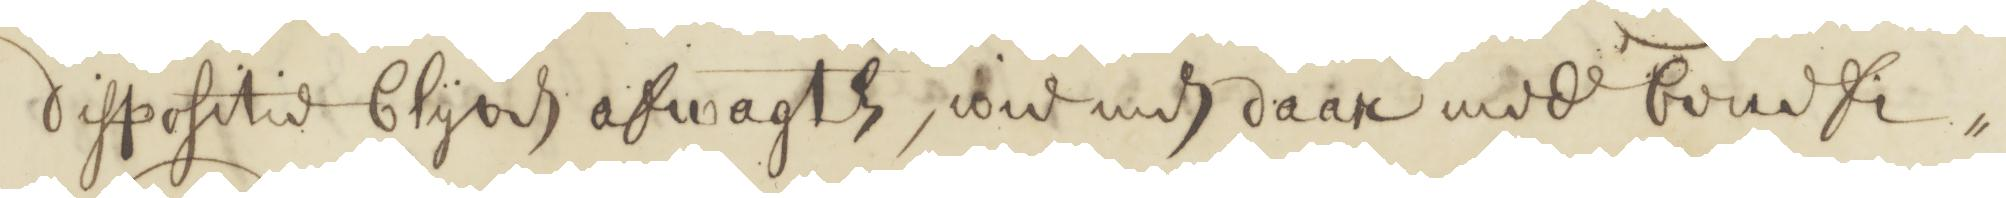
dispositie blijven afwagten, wie men daar mede benefi„
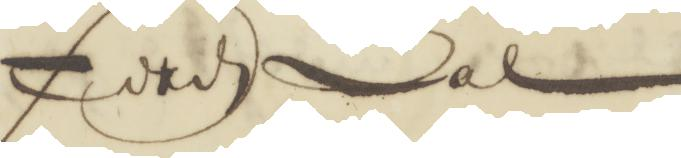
ceren zal
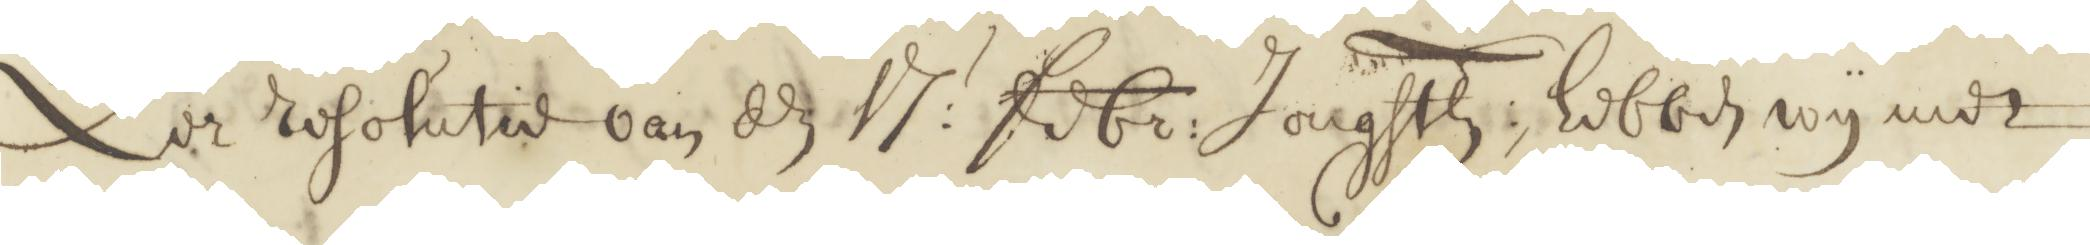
Ter resolutie van den 17:' febr: Jongstl:, hebben wij met
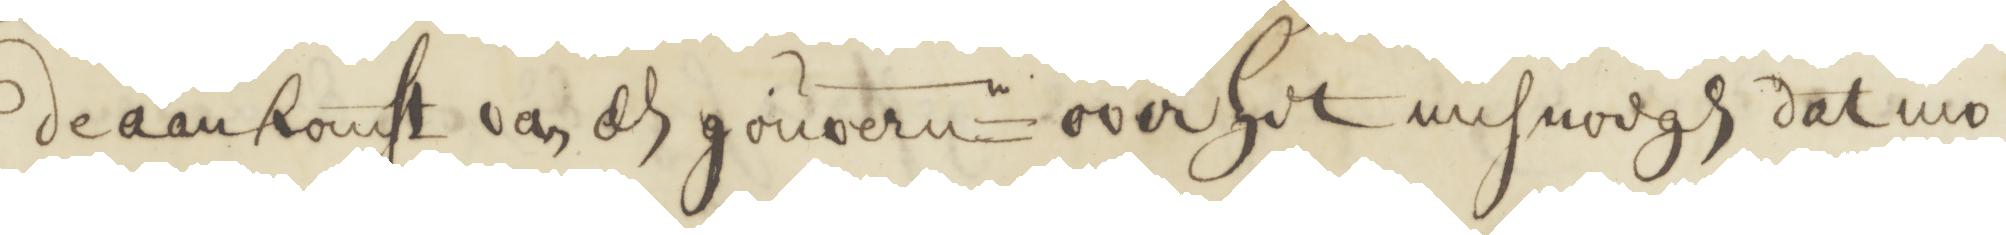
de aankomst van den gouvern=r over het misnoegen dat uw
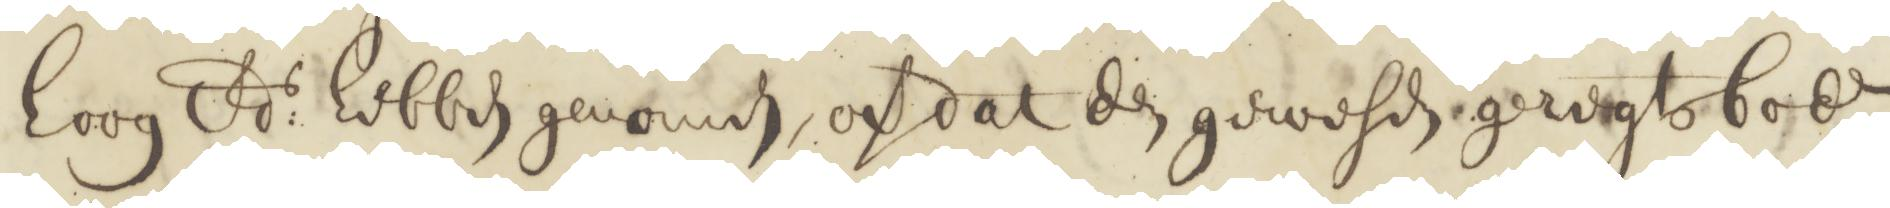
hoog Ed:s hebben genomen, over dat den gewesen geregtsbode
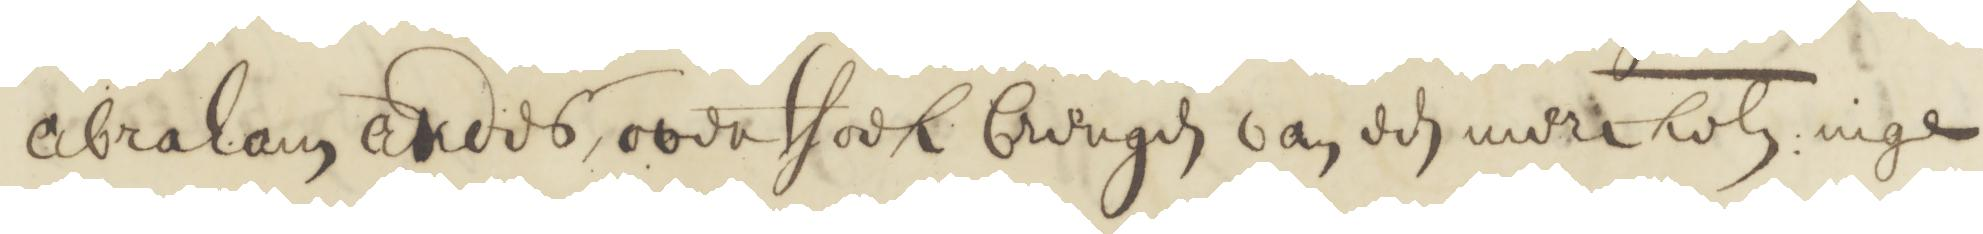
abraham ardes, over 't soek brengen van een merckelijk inge
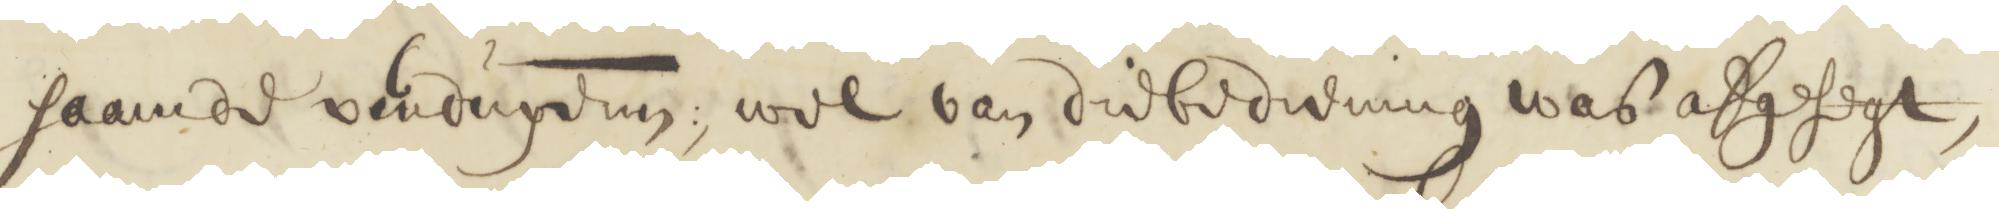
saamde verduxem:, wel van die bediening was afgesegt,
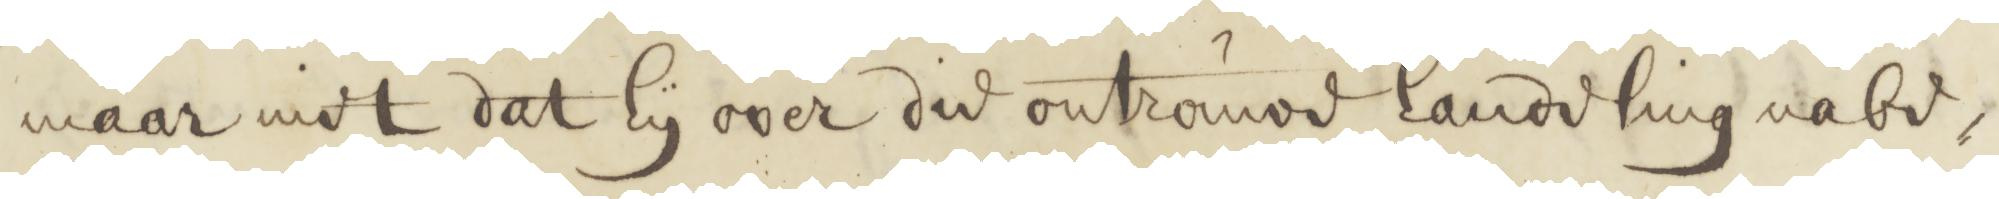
maar niet dat hij over die ontrouwe handeling nabe„
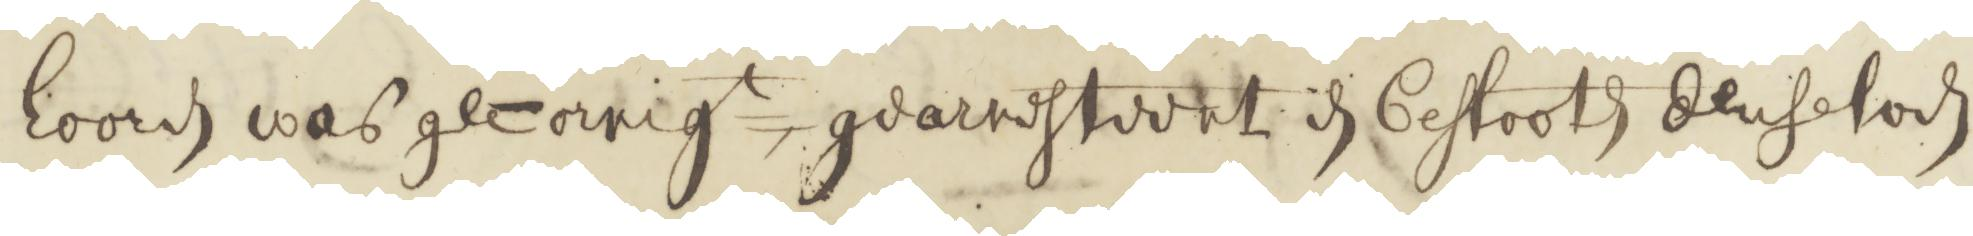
hooren was gecorrig=t, gearresteert en beslooten denselven
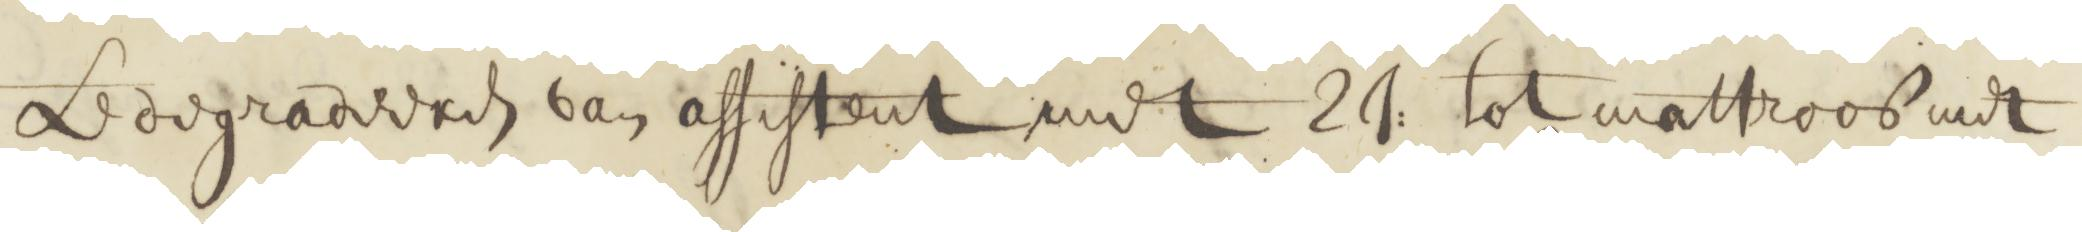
te degradeeren van assistent met 24: tot mattroos met
